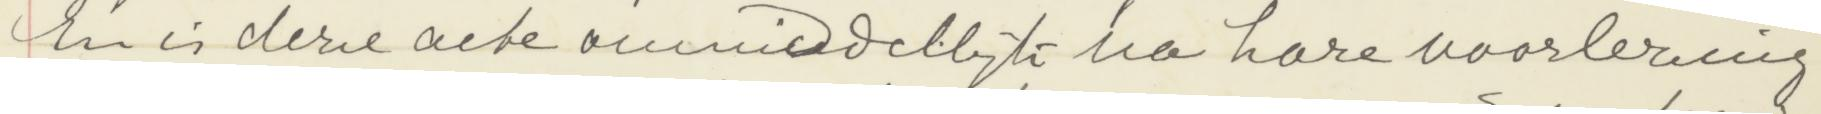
En is deze acte ommiddellijk na hare voorlezing
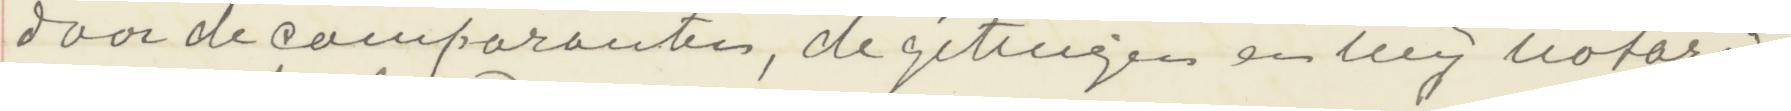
door de comparanten, de getuigen en mij notaris
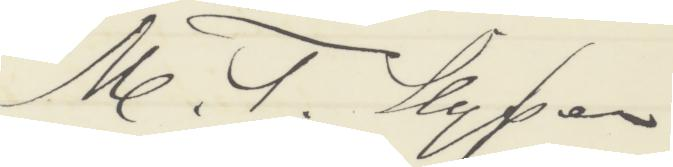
M.T. Slyper
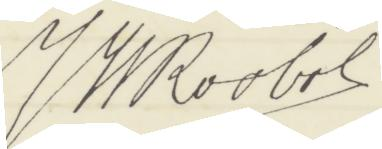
JWRoobol
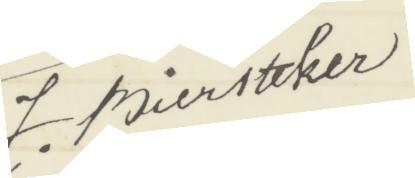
J.Biersteker
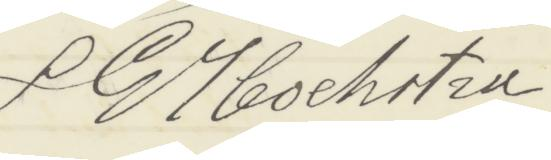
S G Hoekstra
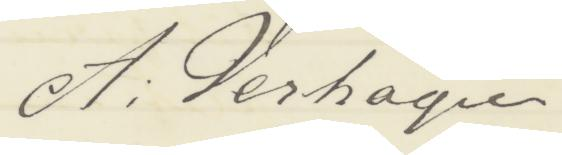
A: Verhagen
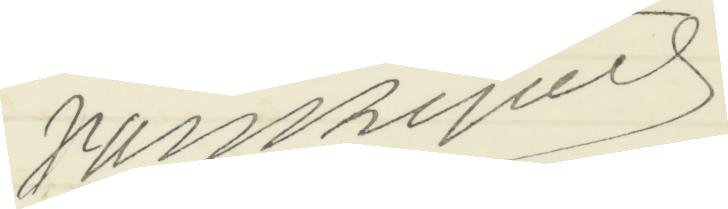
VanRijsel
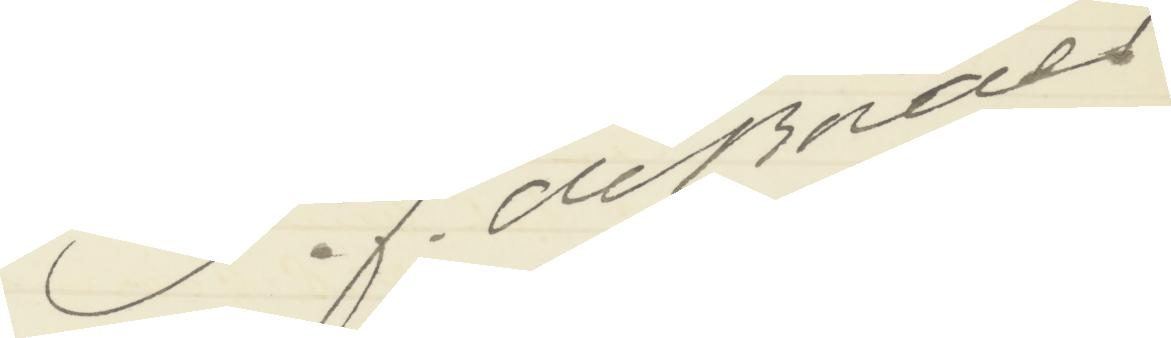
P.f.deBordes
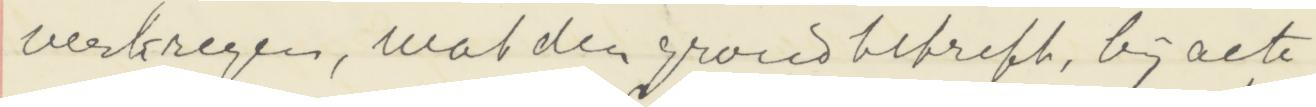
verkregen, was den grond betreft, bij acte
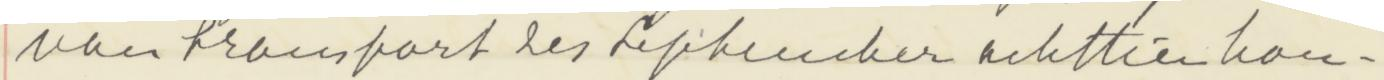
van transport zes September achttien hon-
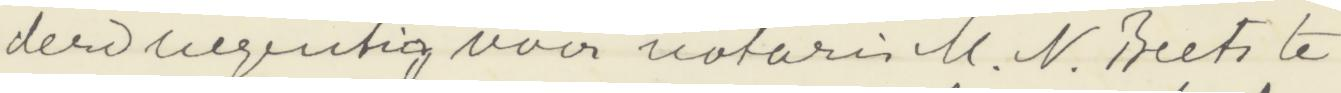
derd negentig voor notaris M.N. Beets te
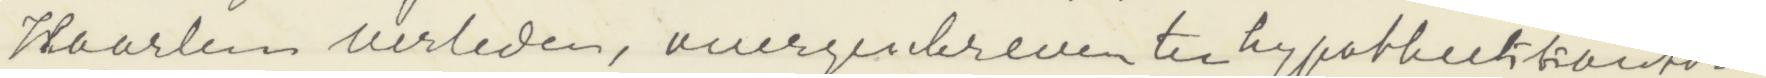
Haarlem verleden, overgeschreven ter hypotheekkantore
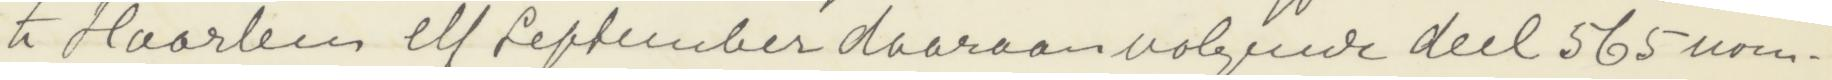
te Haarlem elf September daaraanvolgende deel 565 nom-
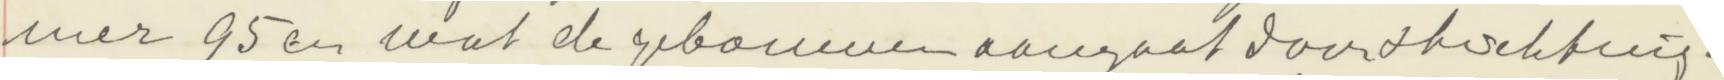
mer 95 en wat de gebouwen aangaat door stichting.
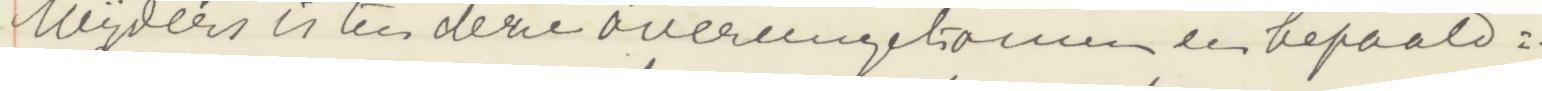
Wijders is ten deze overeengekomen en bepaald:
